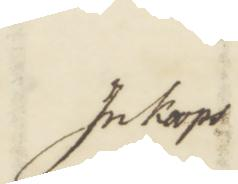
Jnkoops
